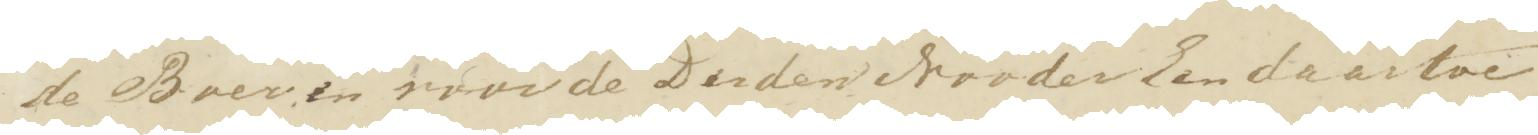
de Boer, en voor de Derden Nooder Een daartoe
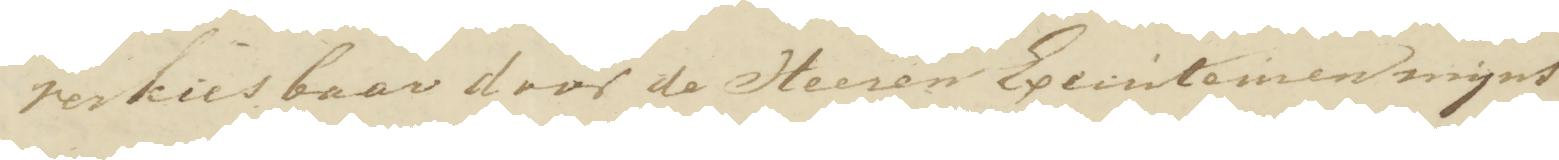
verkiesbaar door de Heeren Executeuren mijns
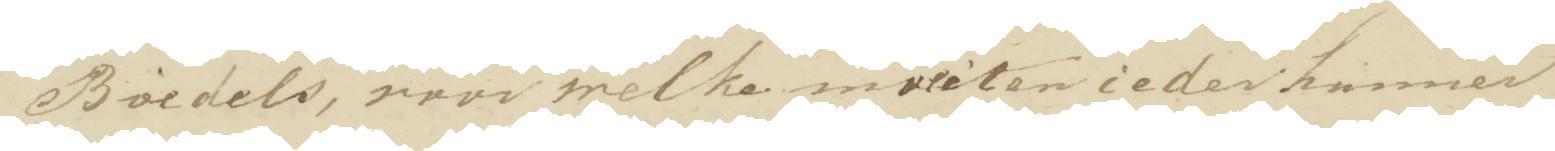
Boedels, voor welke moeten ieder hunner
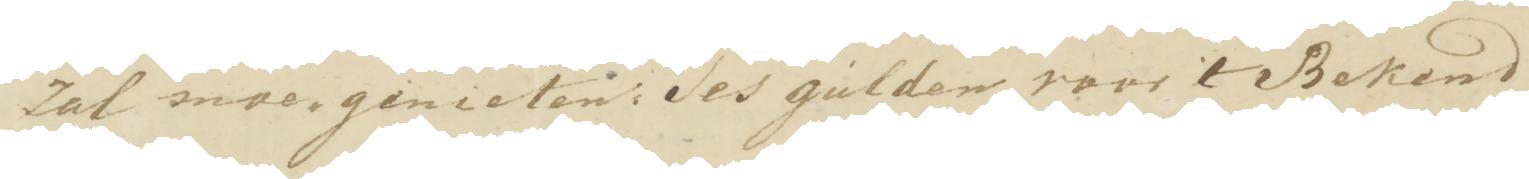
zal moe„ genieten ses gulden voor ’t Bekend
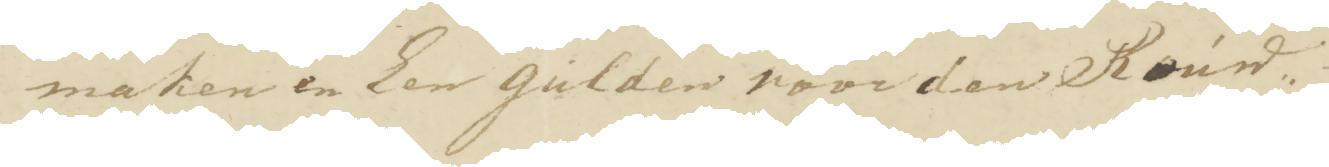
maken en Een gulden voor den Rouw.
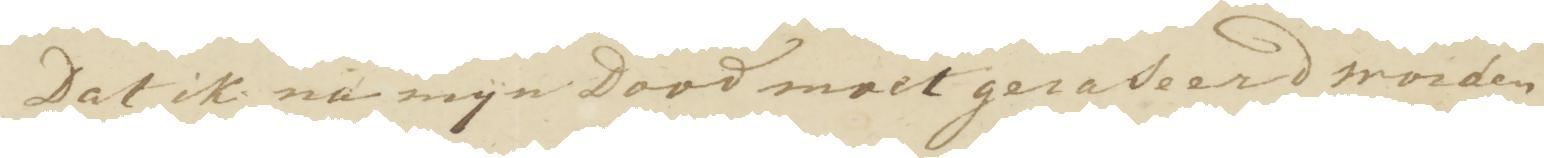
Dat ik na mijn Dood moet geraseerd worden
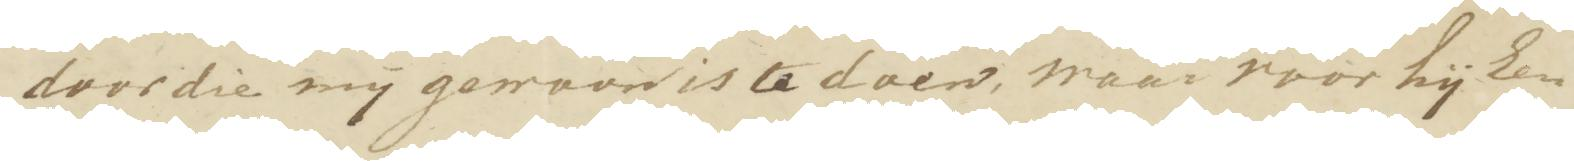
door die mij gewoon is te doen, waar voor hij Een
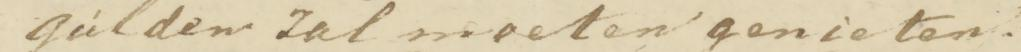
gulden zal moeten genieten.
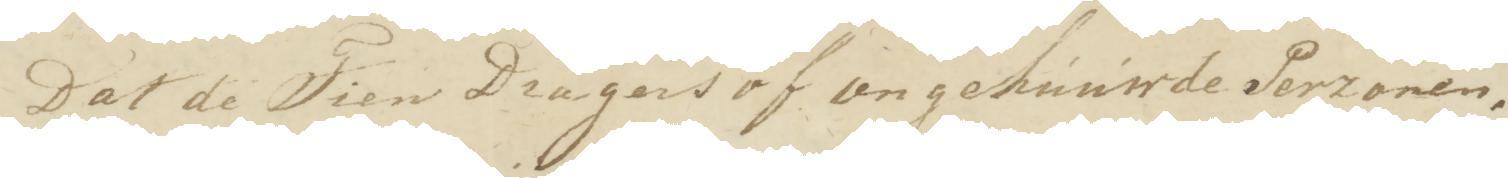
Dat de Vier Dragers of ten gehuurde Perzonen,
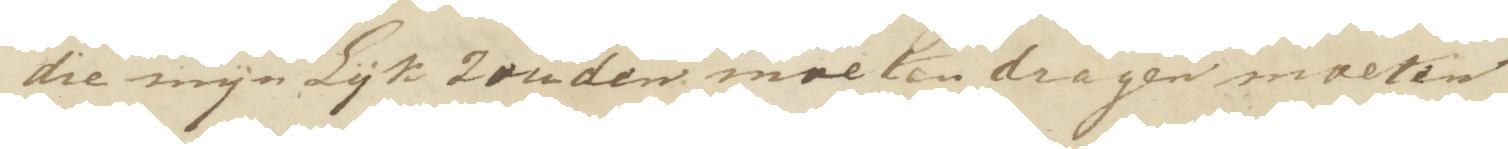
die mijn Lijk zouden moeten dragen moeten
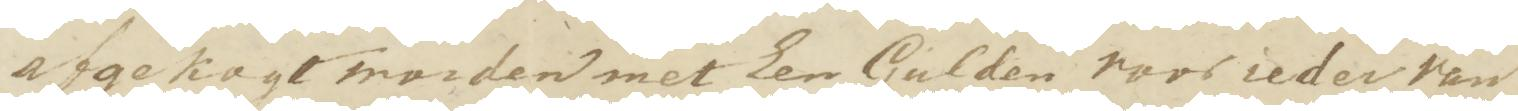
afgekogt worden met Een Gulden voor ieder van
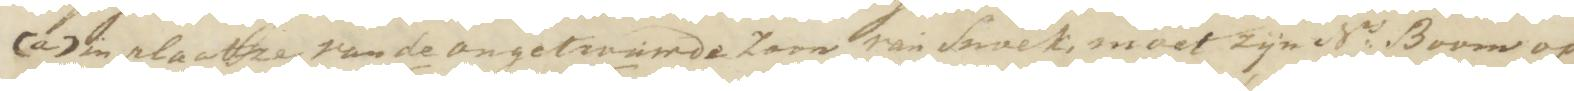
(a) in plaatze van de ongetrouwde Zoon van Snoek moet zijn N:r Boom op
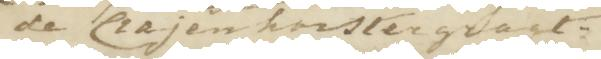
de Crajenhorstergragt=
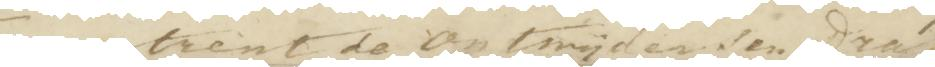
omtrent de ontwijders en Dra
